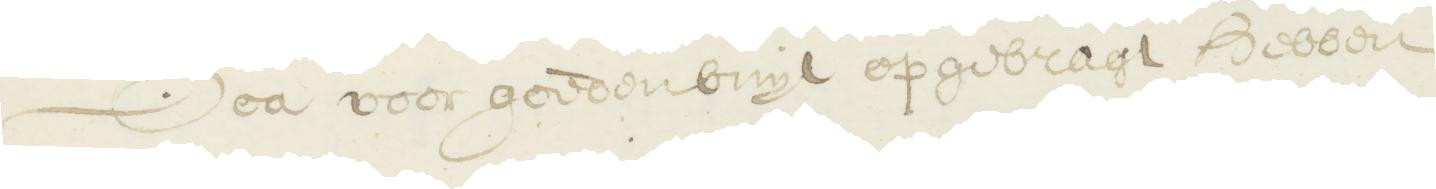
Goa voor goeden buijt op gebragt hebben
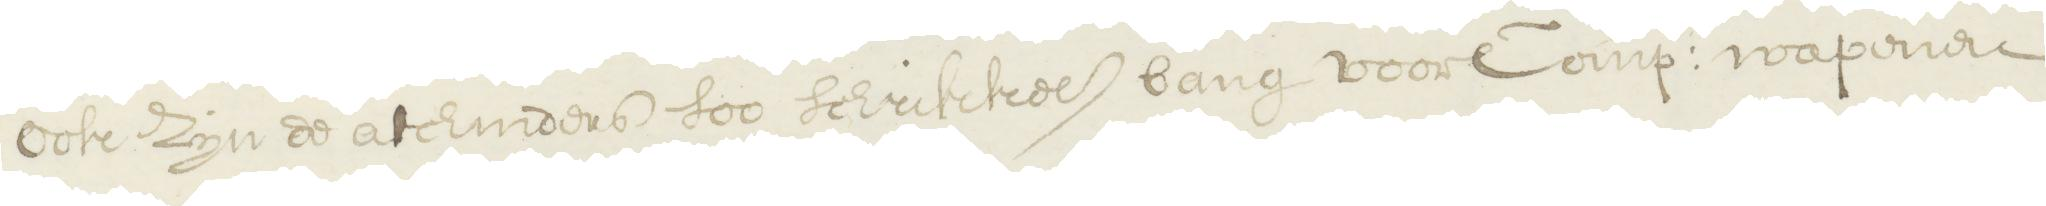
ook zijn de atchinders soo schrikkelijk bang voor Comp:s wapenen
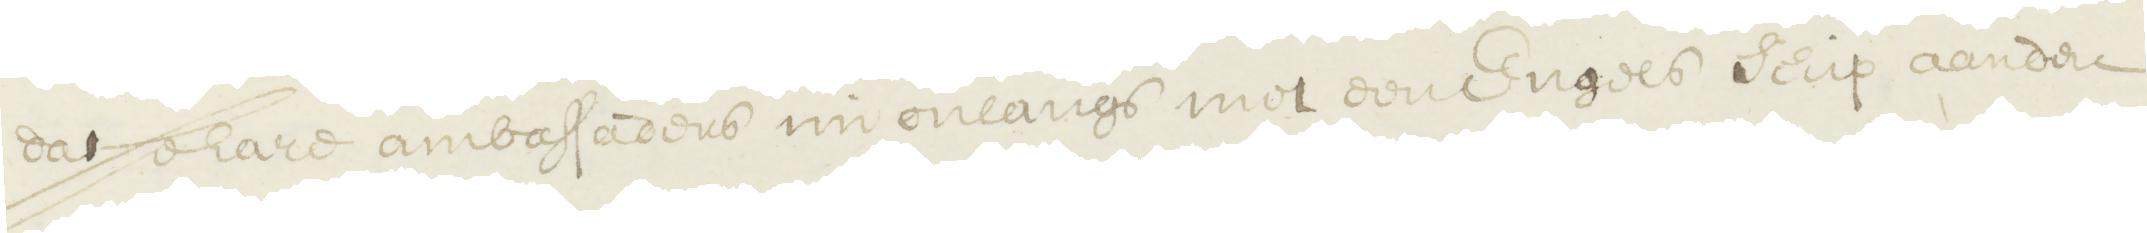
datse hare ambassaders nu onlangs met een Engels schip aan den
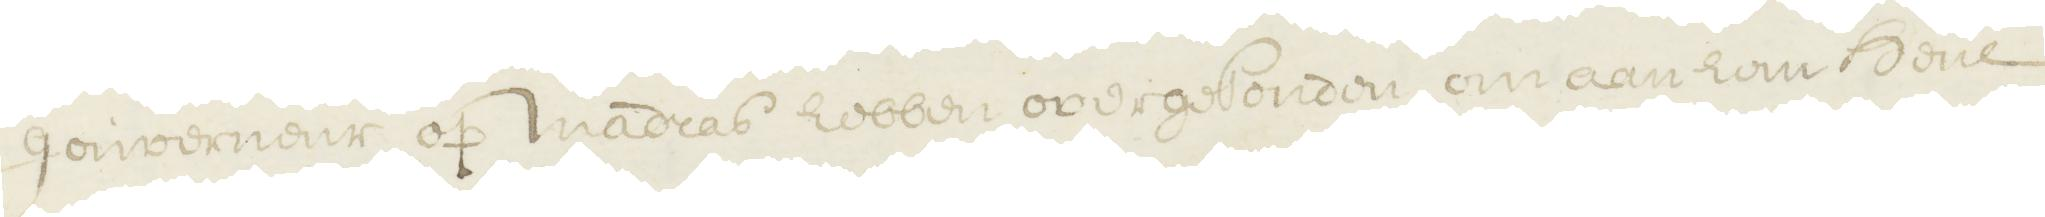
gouverneur op Madras hebben overgesonden, om aan hem Heil
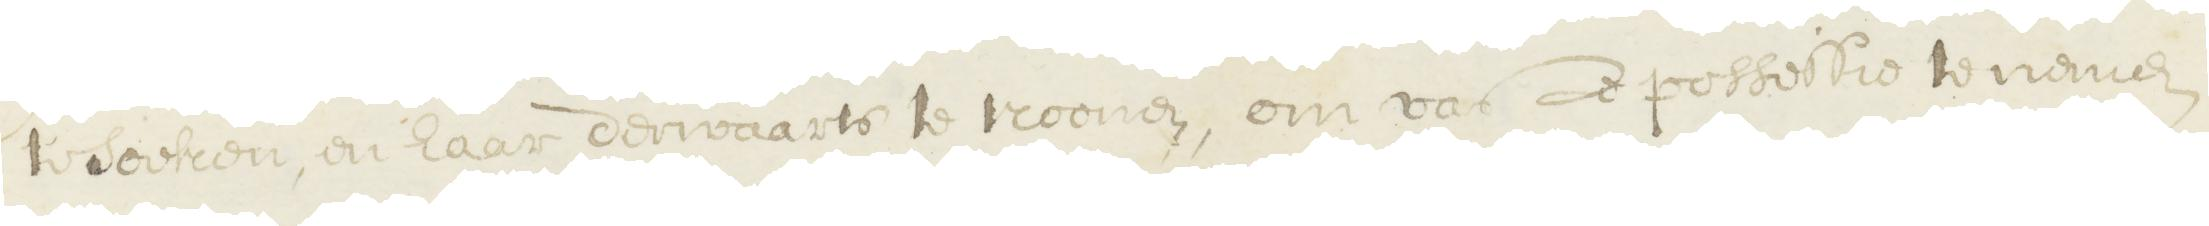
te soeken, en haar derwaarts te troonen, om vaste possessie te nemen
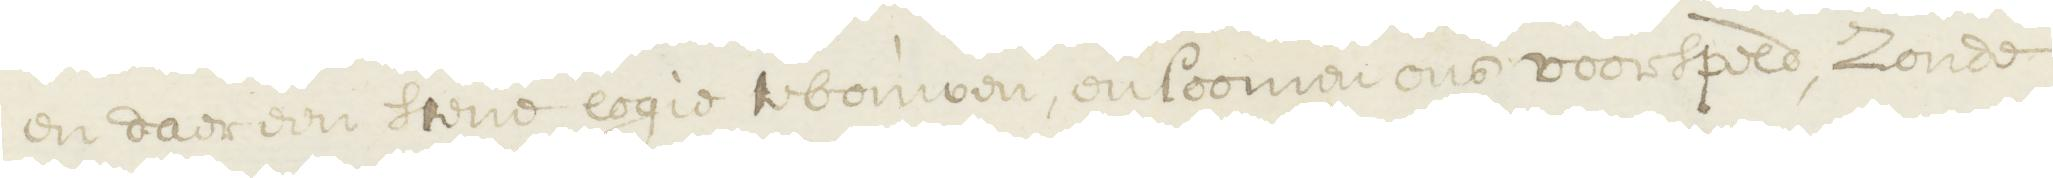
en daer een stene logie tebouwen, en soomen ons voorspeld, zoude
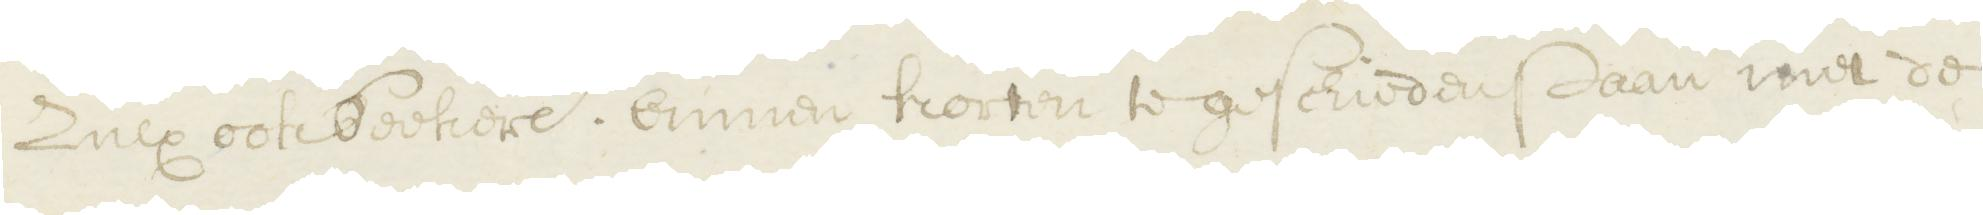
zulx ook Seekere. binnen korten te geschieden staan met de
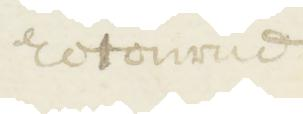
retourne
